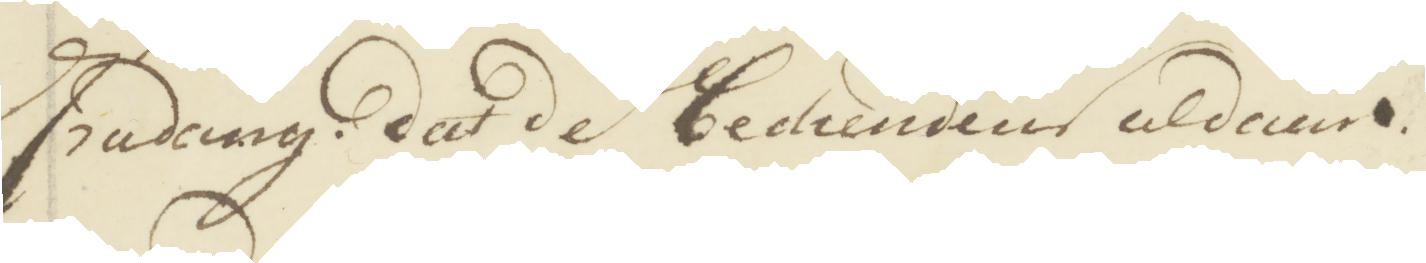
padang dat de bediendens aldaar.
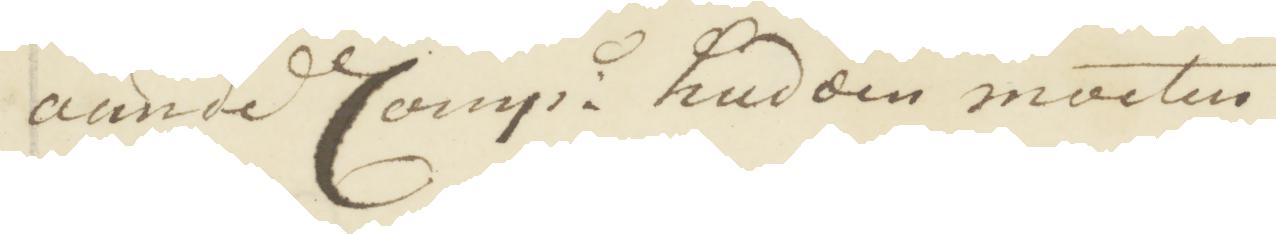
aan de Comp:s hadden moeten
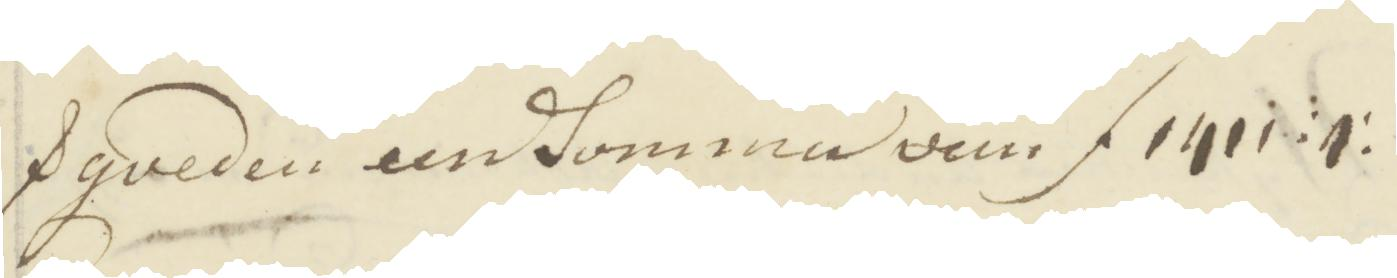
vergoeden een somma van ƒ 1411: 4:
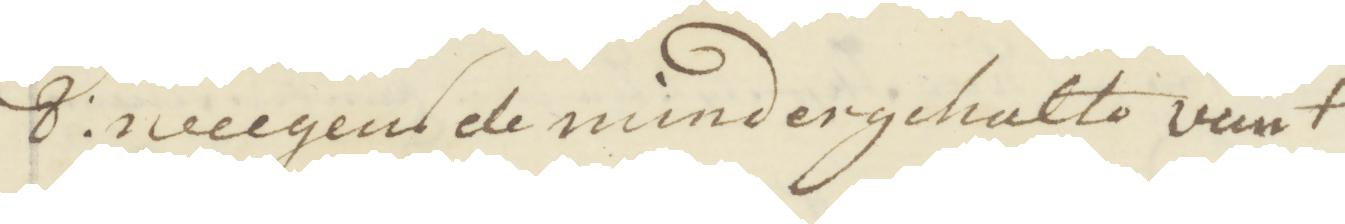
8: weegens de mindegehalte van 't
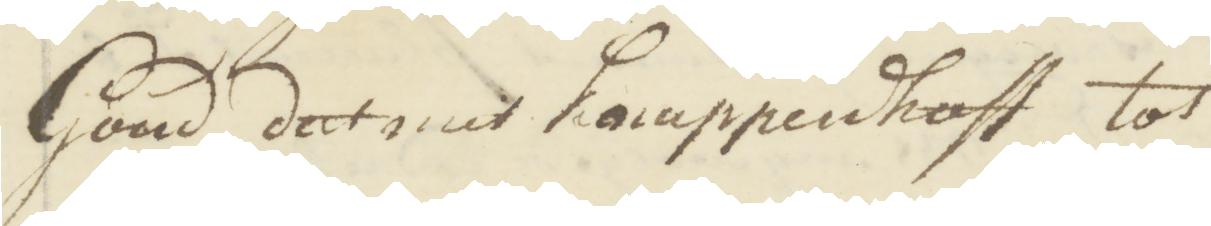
Goud, dat met knappenhoff tot
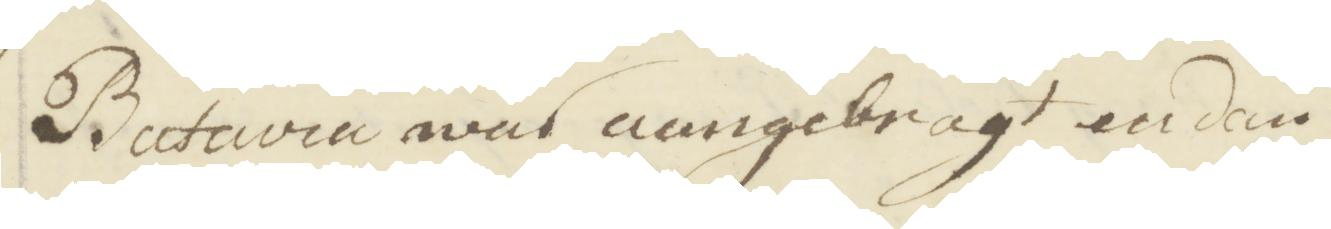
Batavia was aangebragt en dan
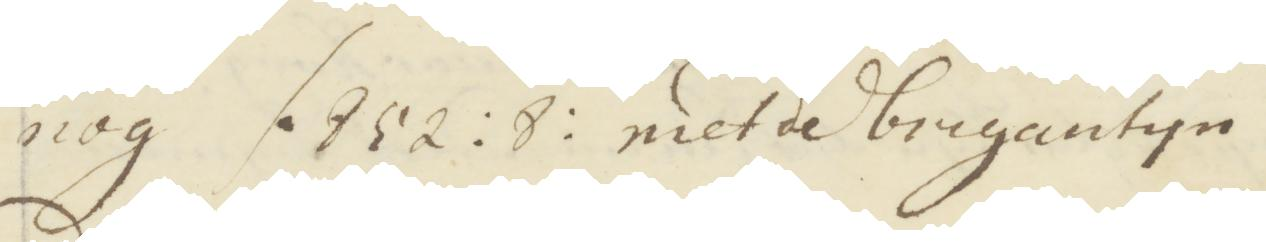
nog ƒ852: 8: met de brigantijn
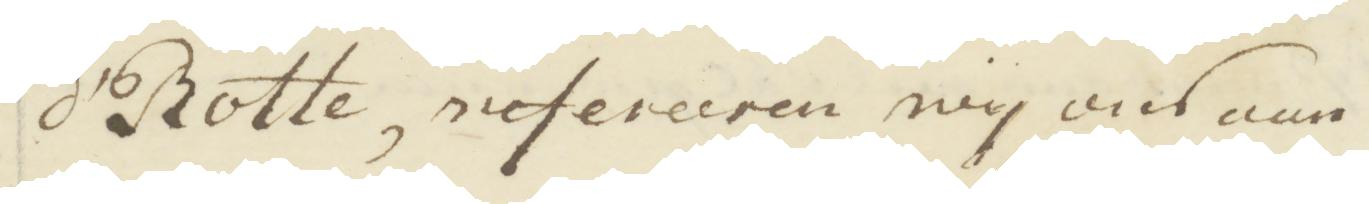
d'Rotte, refereeren wij ons aan
